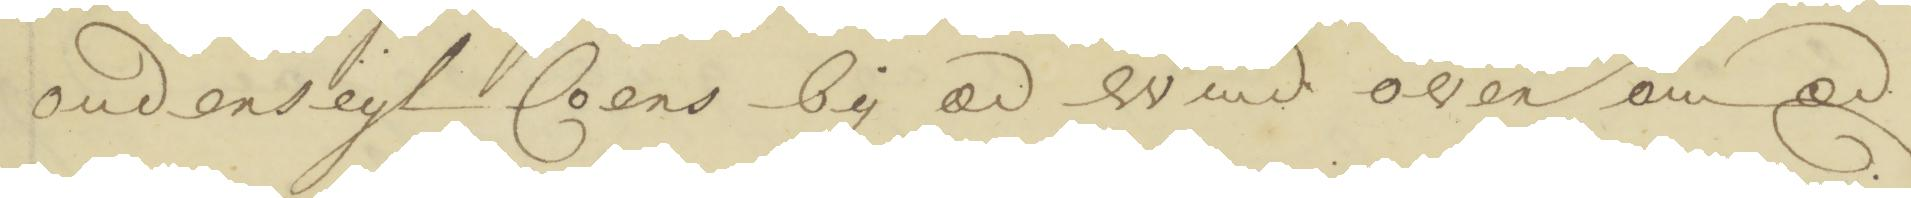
onderseijl Coers bij de wind over om de
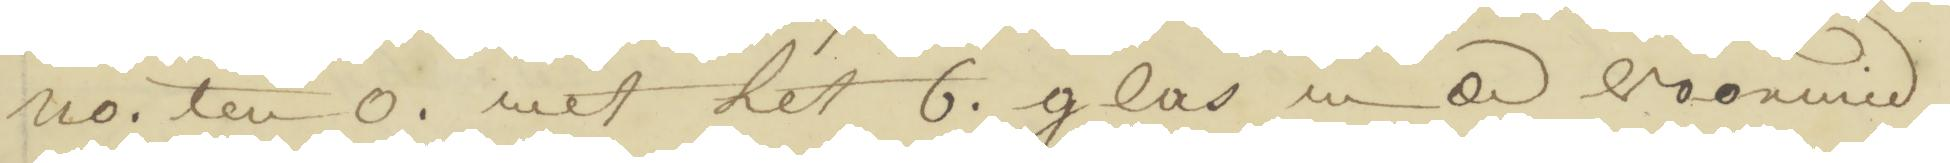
no. ten O. met het 6. glas in de voormid,
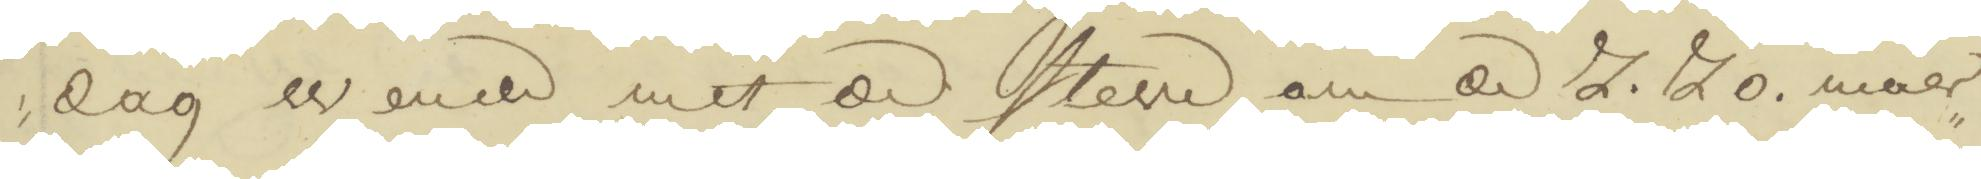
„dag wende met de Steve om de Z. Zo. maer„
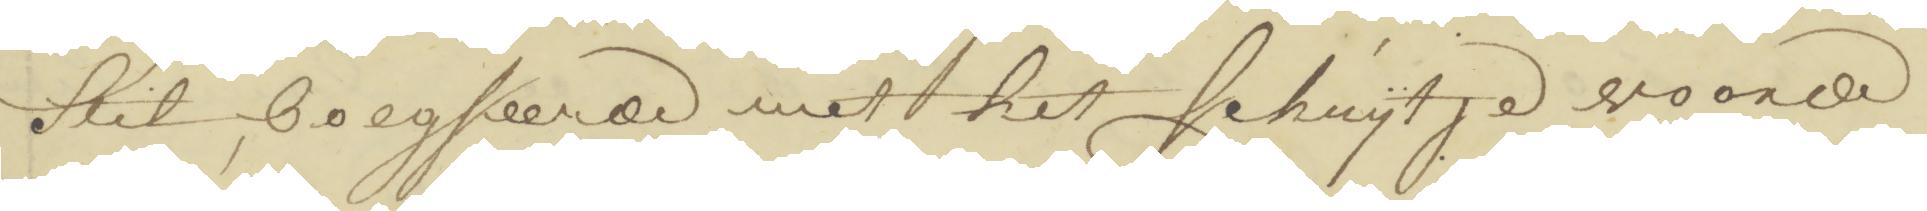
Stil, boeg keerde met het Schuijtje voor de
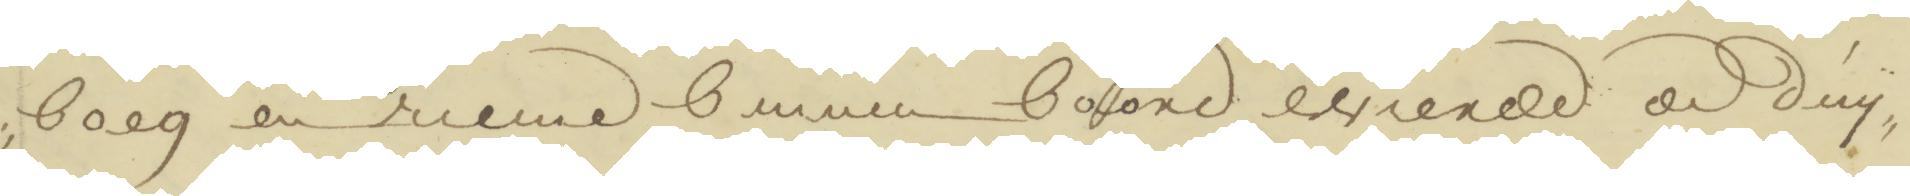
„boeg en rieme binnen boord, wierde de duij„
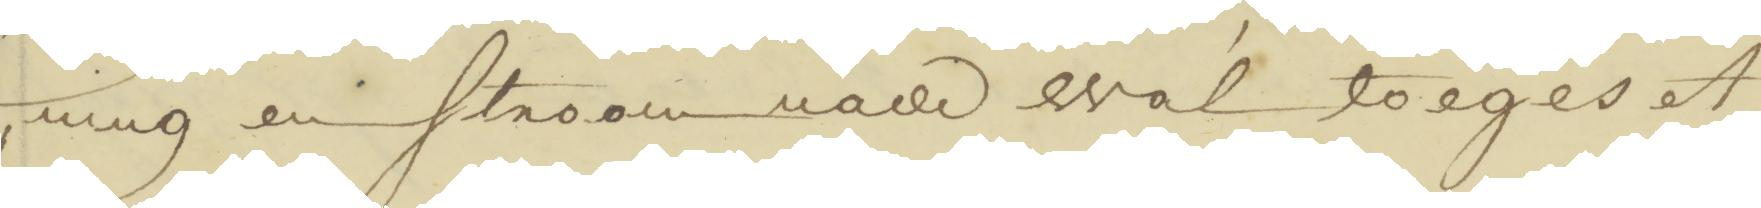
„ning en Stroom nade wal toegeset
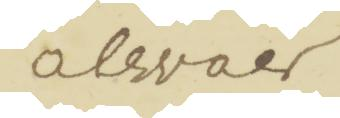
alwaer
